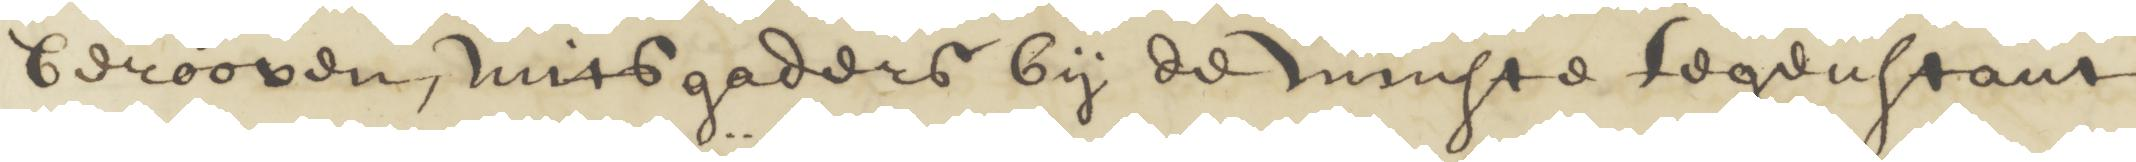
berooven, mitsgaders bij de minste tegenstant
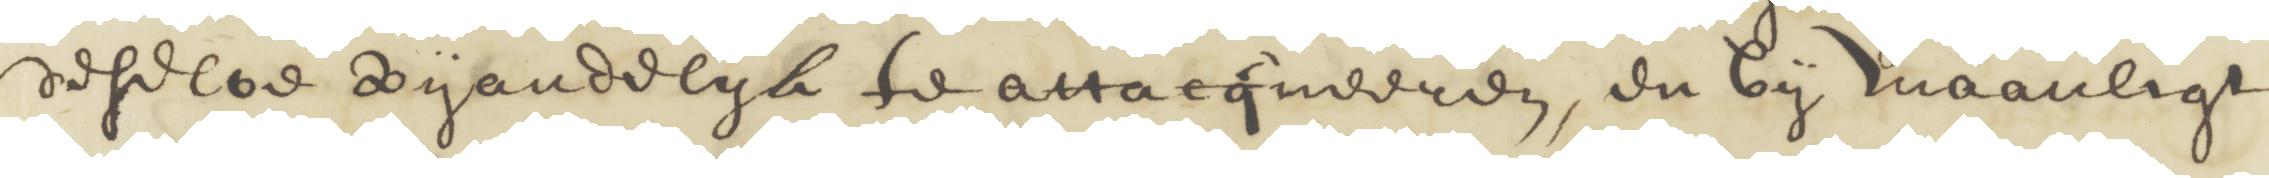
deselve vijandelijk te attacqueeren, en bij maanligt
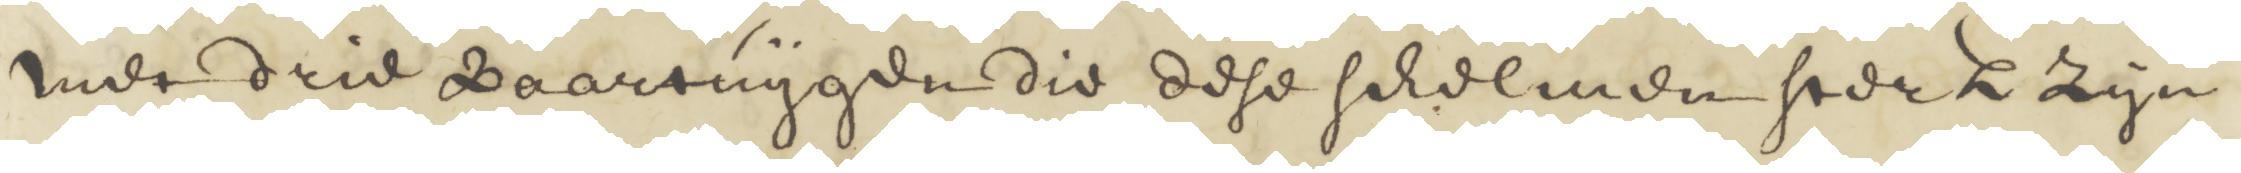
met drie vaartuijgen die dese schelmen sterk zijn
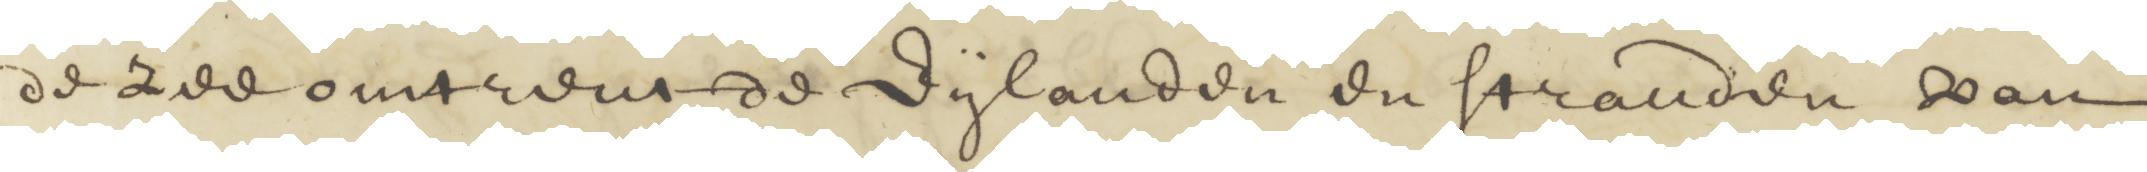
de zee omtrent de Eijlanden en stranden van
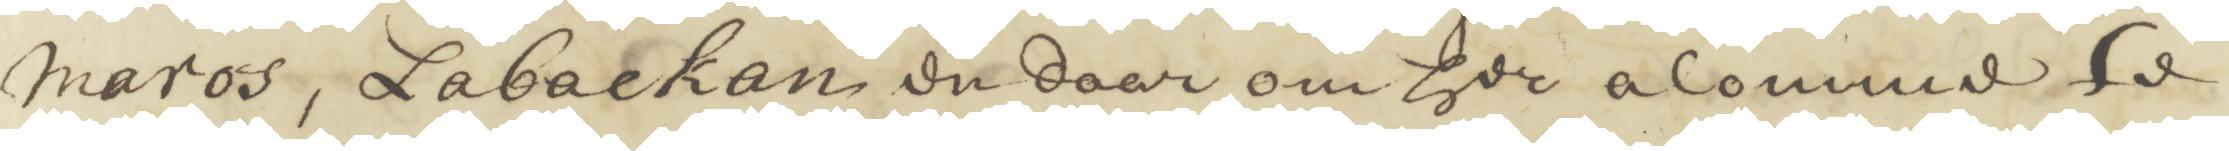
Maros, Labackan, en daar om her alomme te
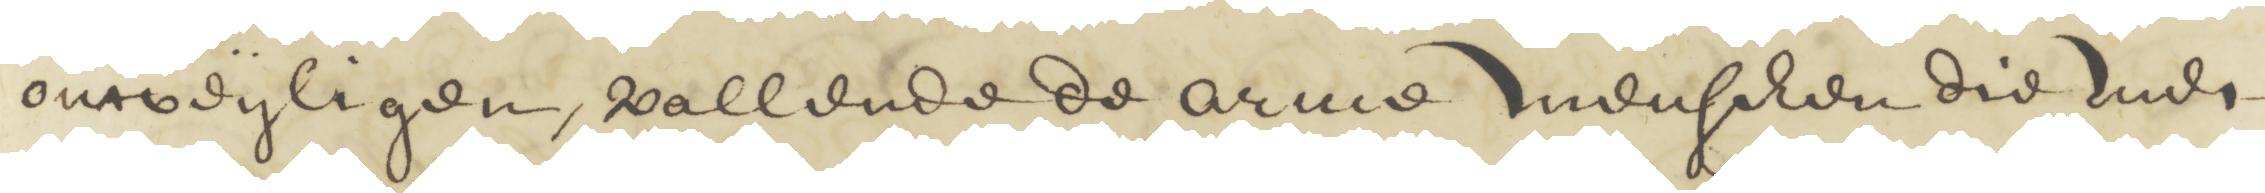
ontveijligen, vallende de arme menschen die met
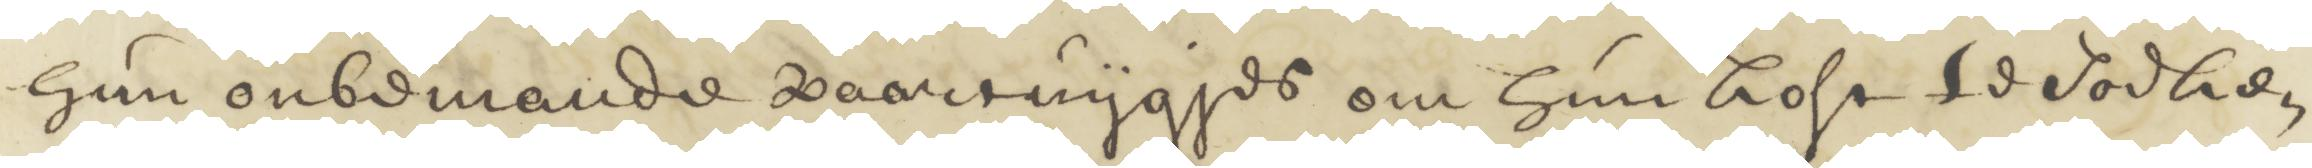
hun onbemande vaartuijgjes om hun kost te soeken
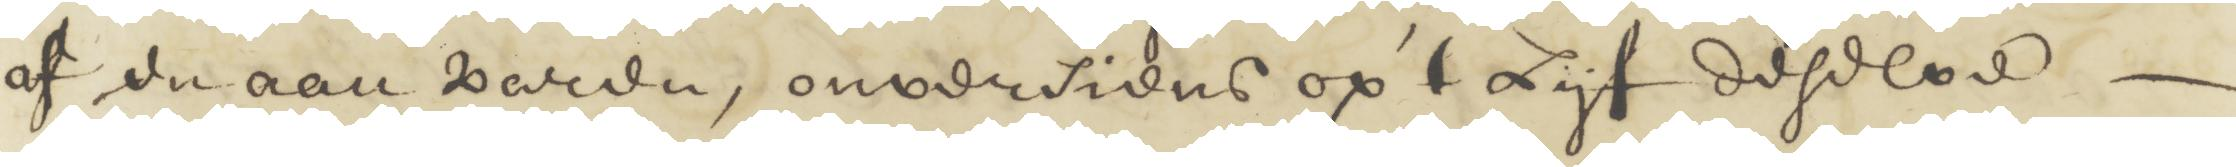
af en aan varen, onversiens op ’t lijf deselve —
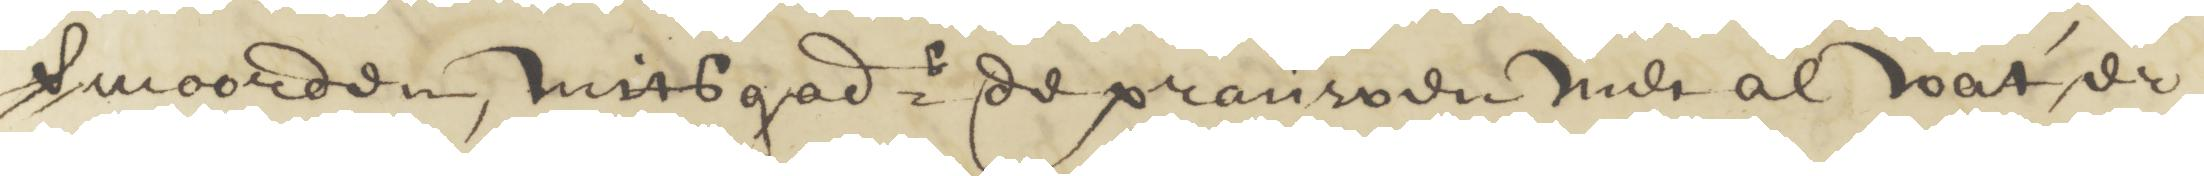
vermoorden, mitsgad=s de prauwen met al wat', er
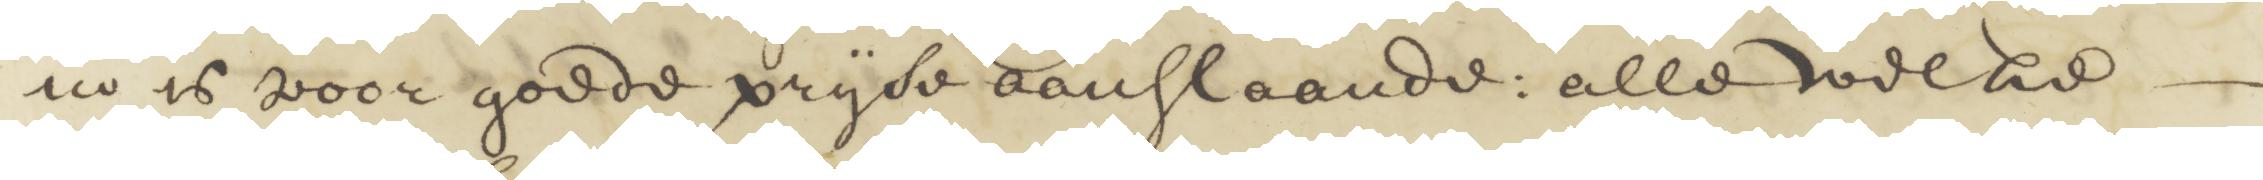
in is voor goede prijse aanslaande: alle welke —
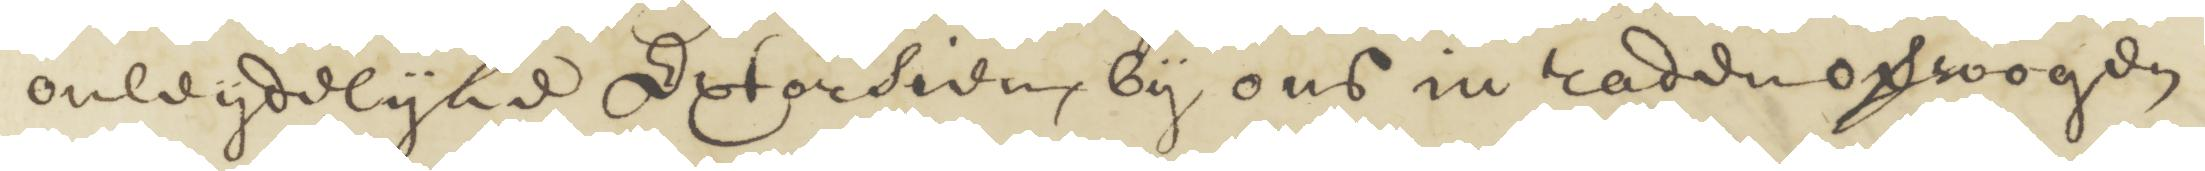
onleijdelijke Extorsien, bij ons in raden overwogen
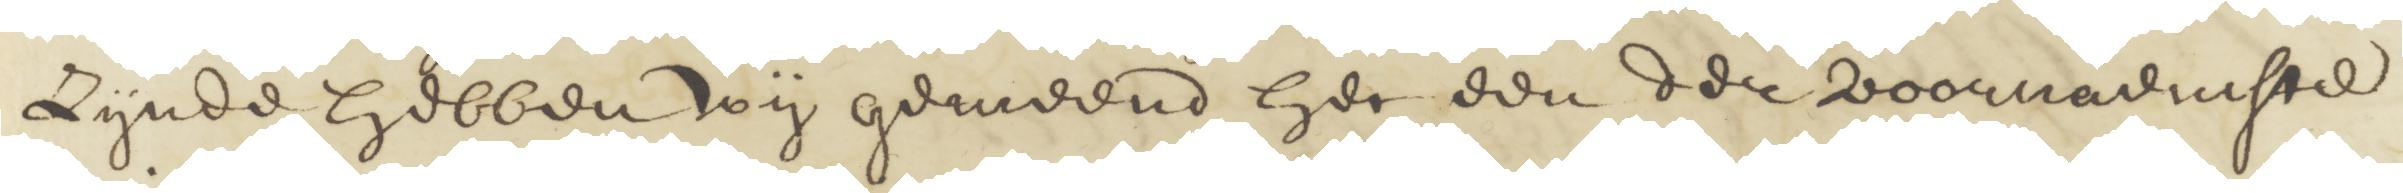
zijnde hebben wij gemeend het een der voornaemste
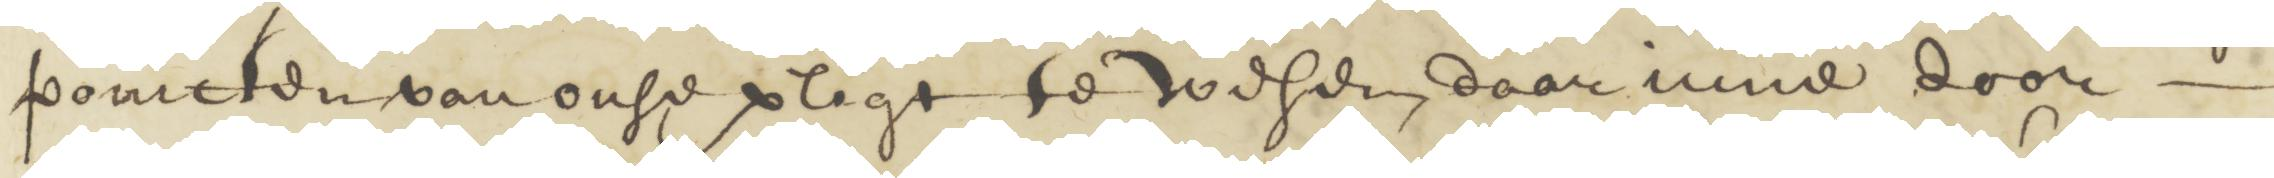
poincten van onse pligt te wesen, daar inne door —
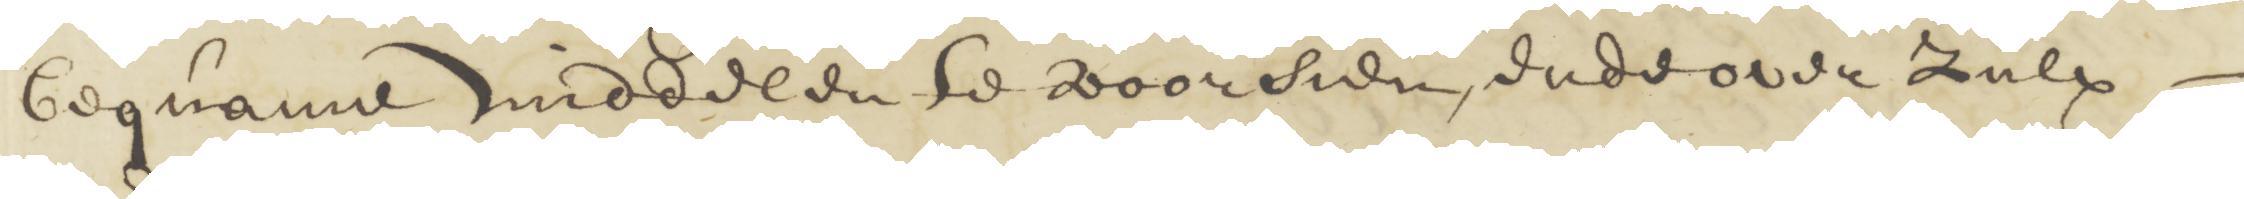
bequame middelen te voorsien, ende over zulx —
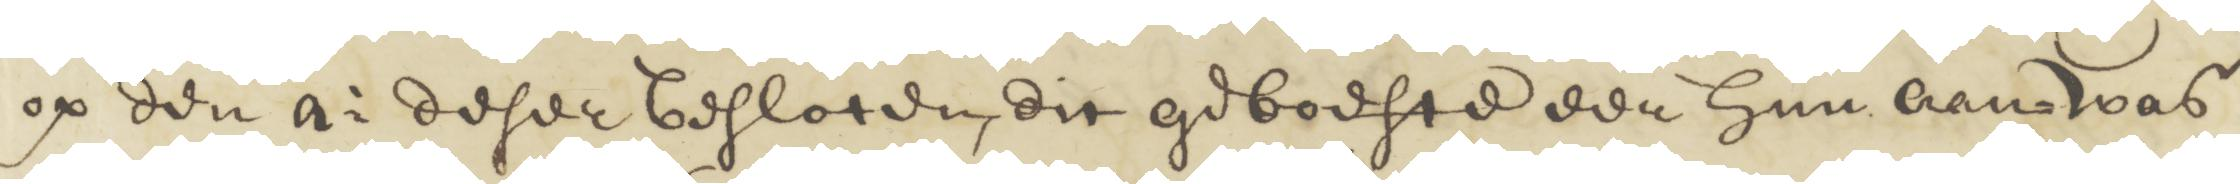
op den 4: deser besloten, dit geboefte eer hun aan-was
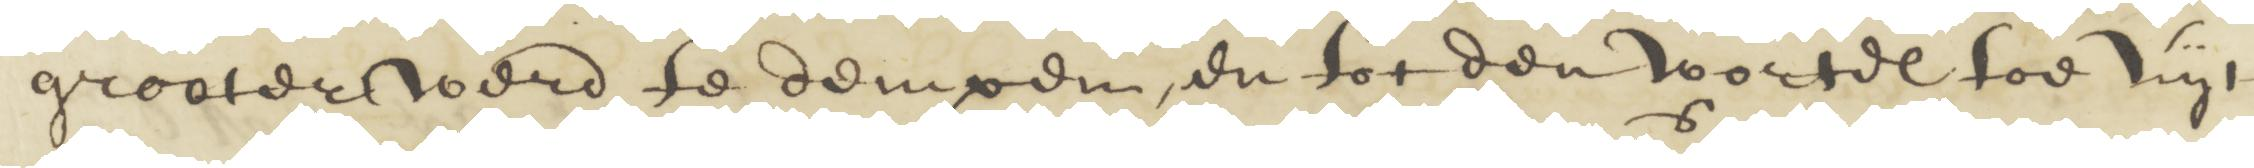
grooter werd te dempen, en tot den wortel toe uijt
